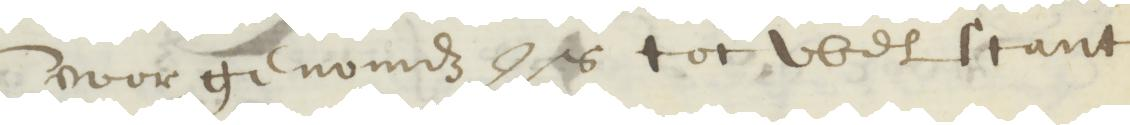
voor genomen Js tot welstant
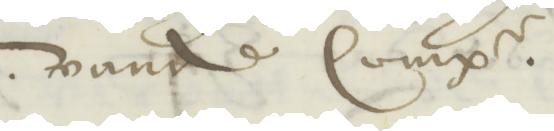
vande Comp.
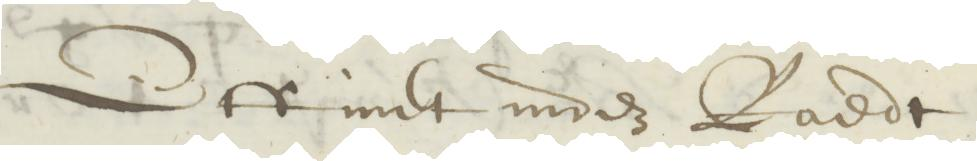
Of niet inden Raedt
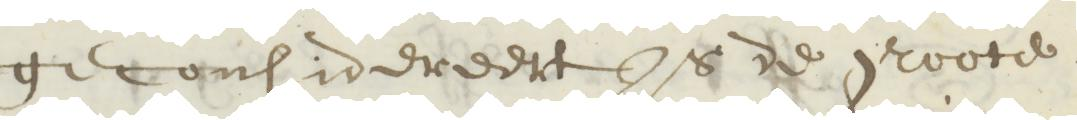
geconsidereert Js de groote
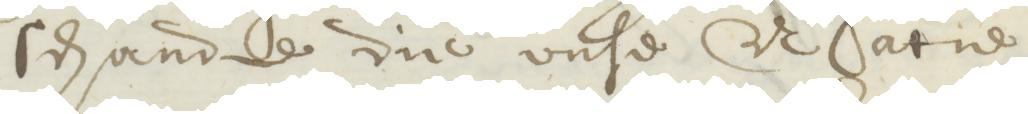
schande die onse Natie
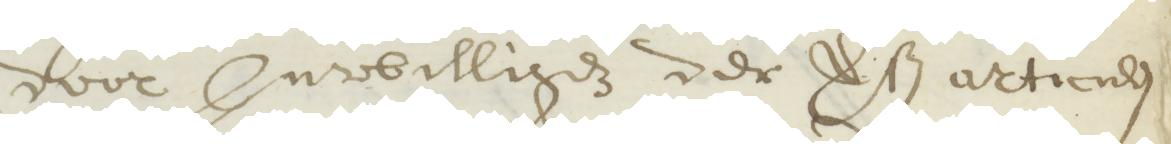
voor Jnwilligen der versz articulen
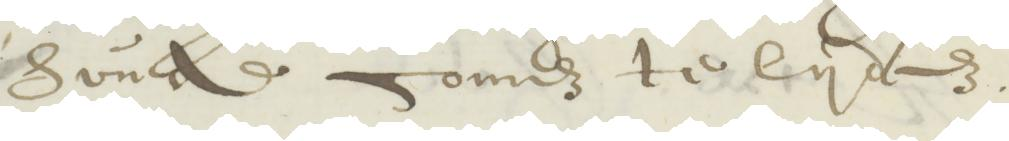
zoude comen te lijden.
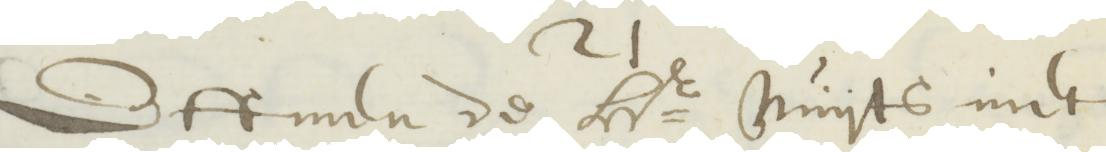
Off men de H=r Nuijts niet
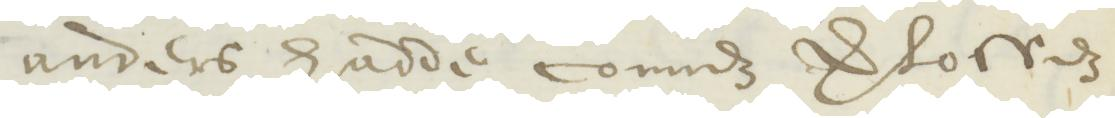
anders hadde connen verlossen
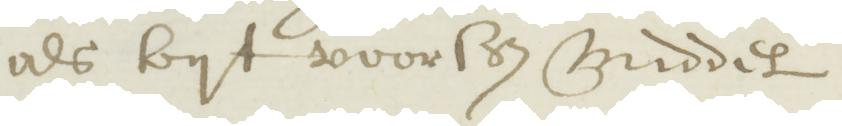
als byt voorsz middel
